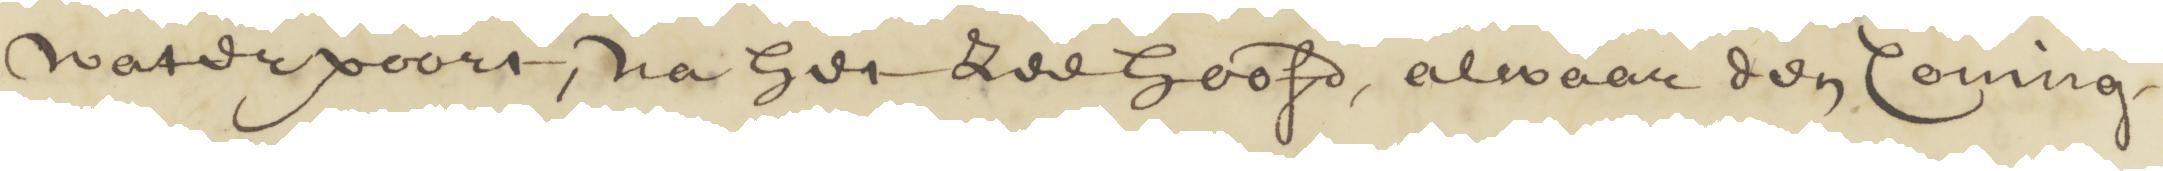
waterpoort, na het zeehoofd, alwaar den Coning
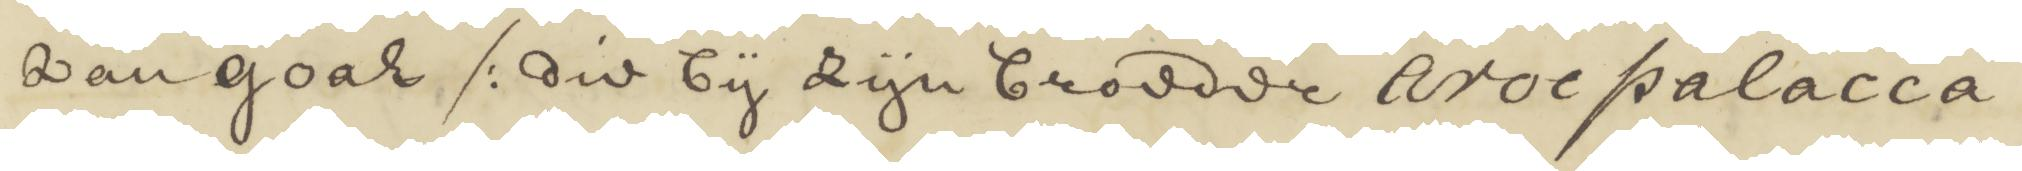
van goah /: die bij zijn broeder aroepalacca
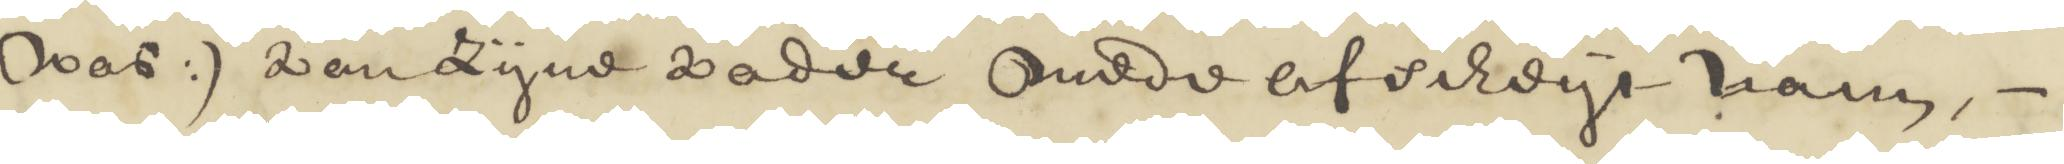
was:) van zijne vader mede afscheijt nam, —
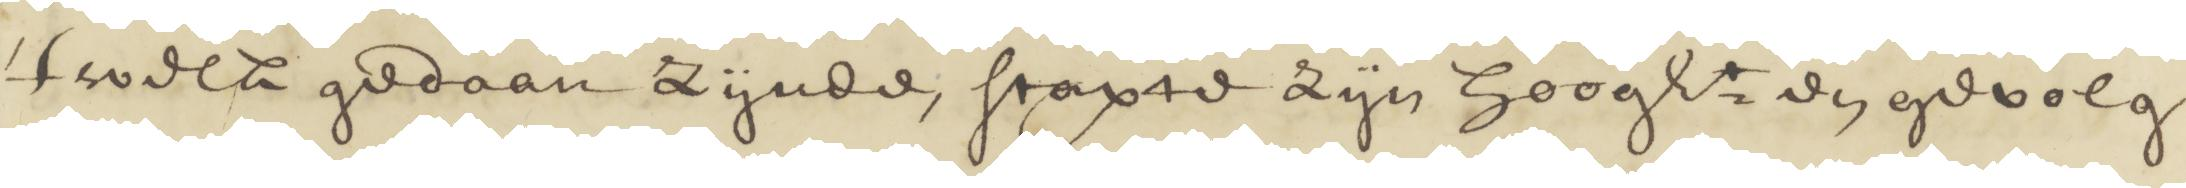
't welk gedaan zijnde, stapte zijn hoogh=t en gevolg
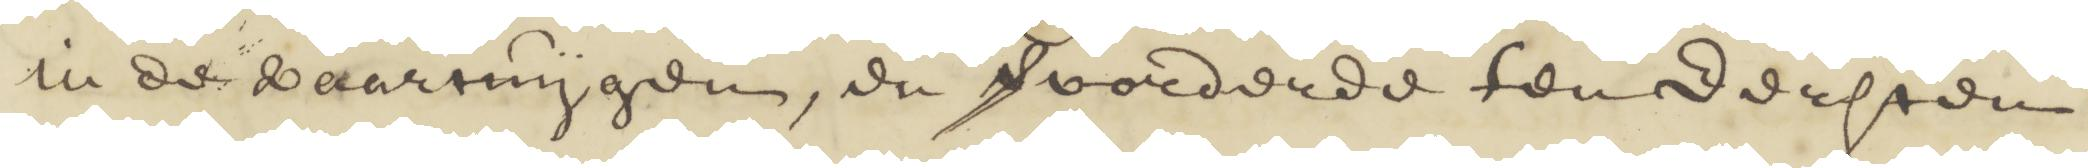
in de vaartuijgen, en vervorderde ten Eersten
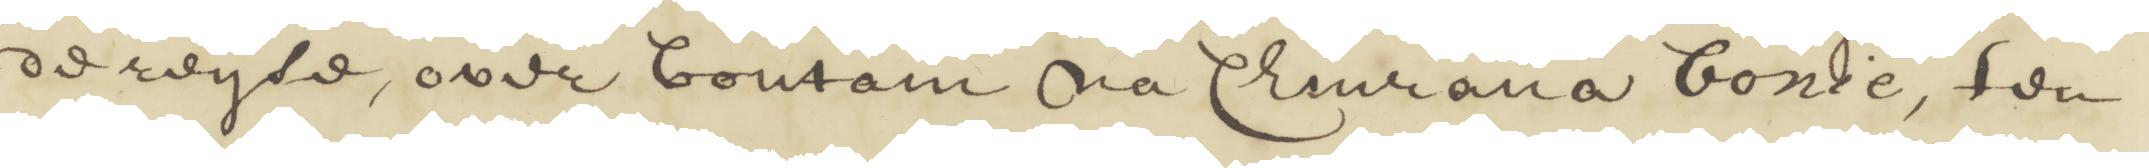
de reijse, over bontam na Chinrana bonie, ten
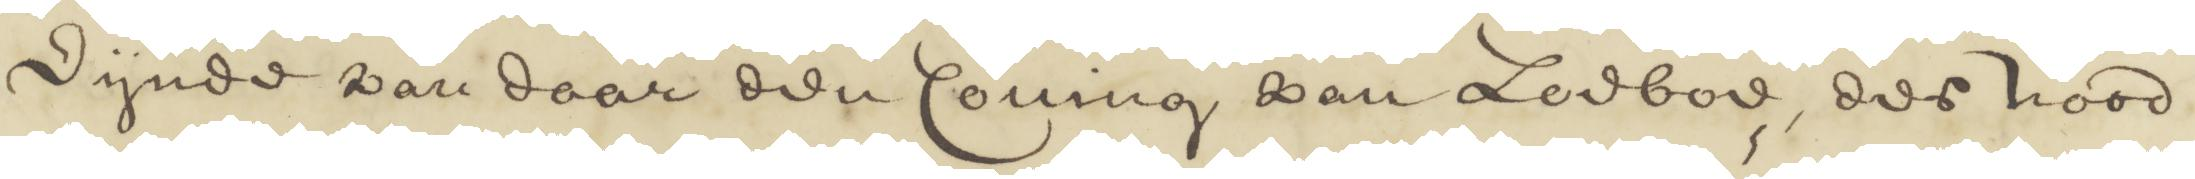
Eijnde van daar den Coning van Loeboe, des nood
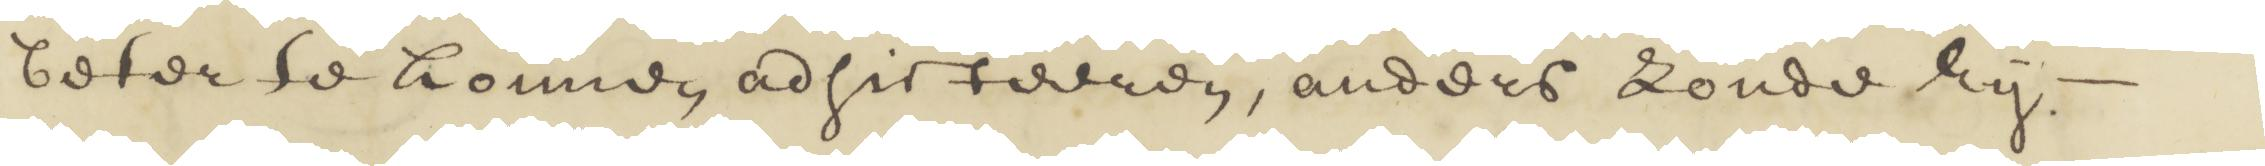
beter te konnen adsisteeren, anders zoude hij.—
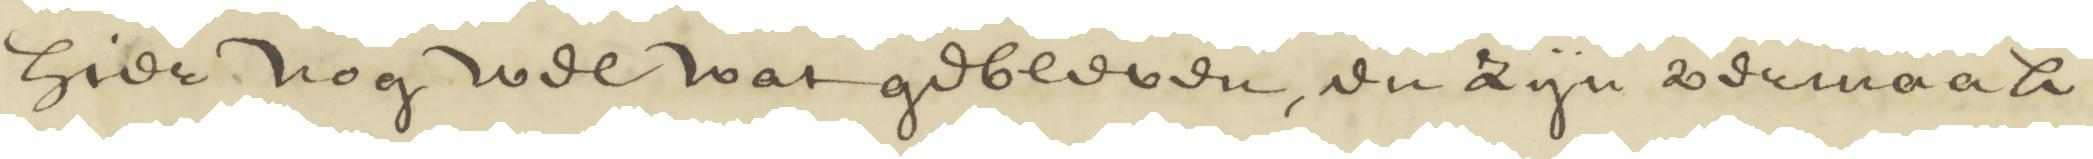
hier nog wel wat gebleven, en zijn vermaak
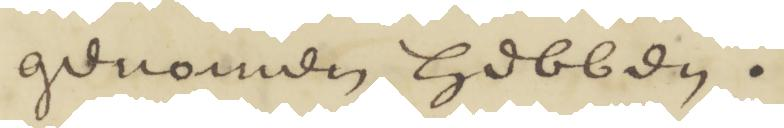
genomen hebben.
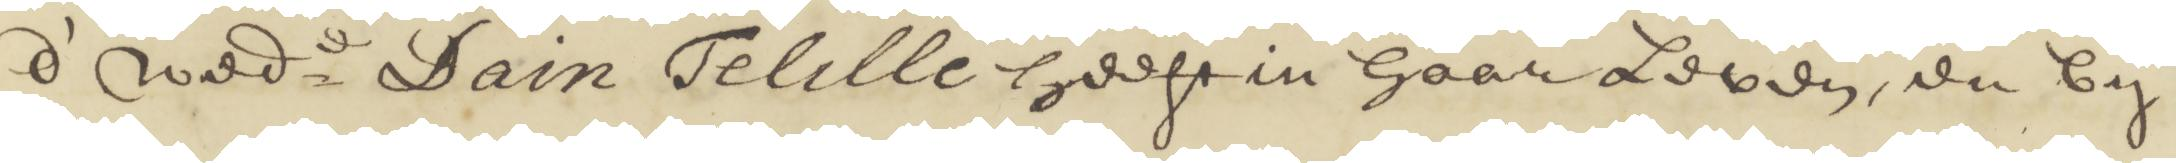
d’ wed=e Dain Telille heeft in haar leven, en bij
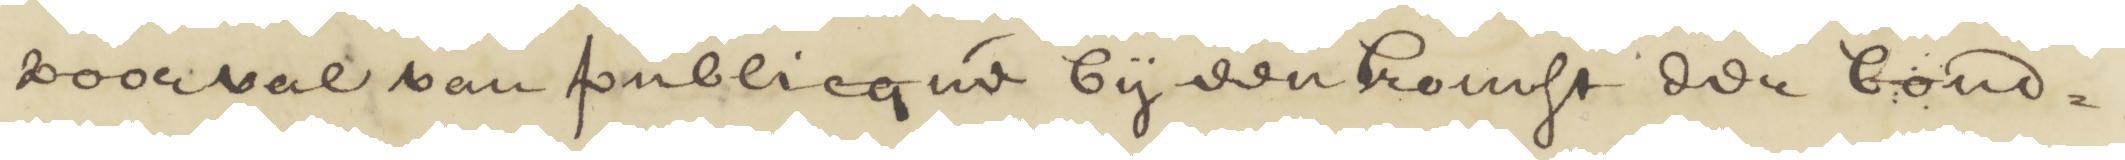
voorval van publicque bij een komst der bond=
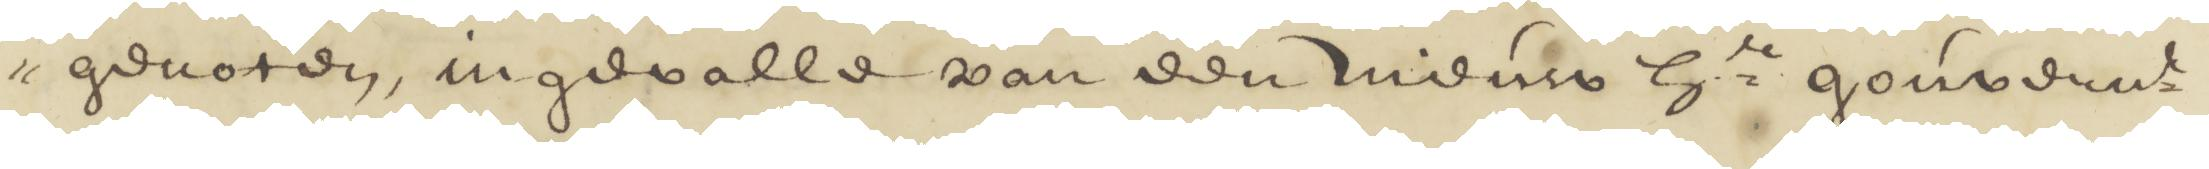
„genoten, ingevalle van een nieuw h=re gouvern=r
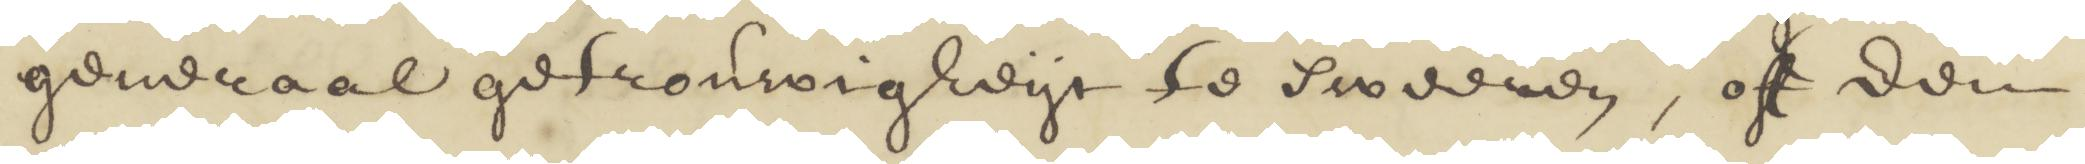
generaal getrouwigheijt te sweeren, off Een
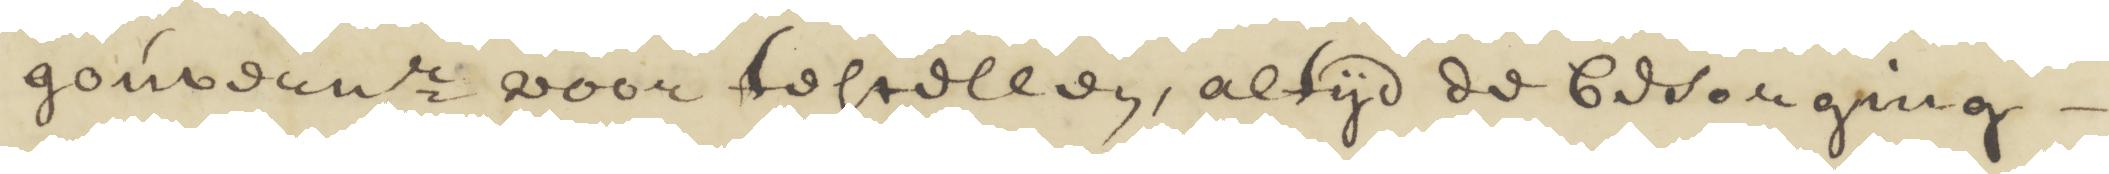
gouvern=r voor te stellen, altijd de besorging—
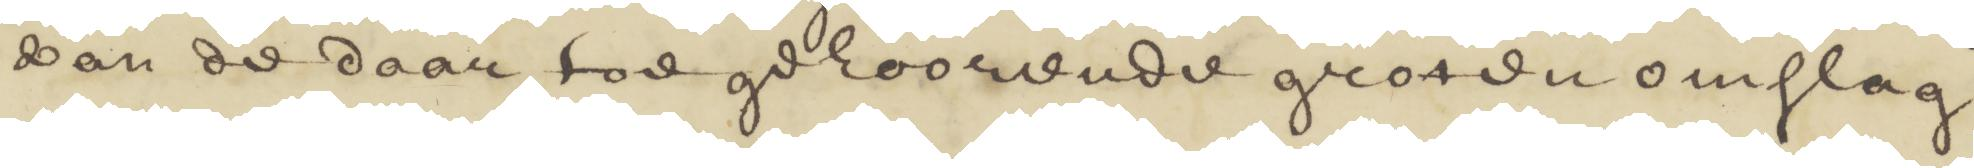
van de daar toe gehoorende groten omslag
